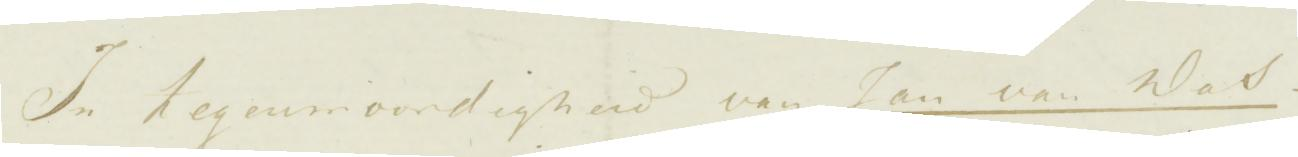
In tegenwoordigheid van Jan van Das
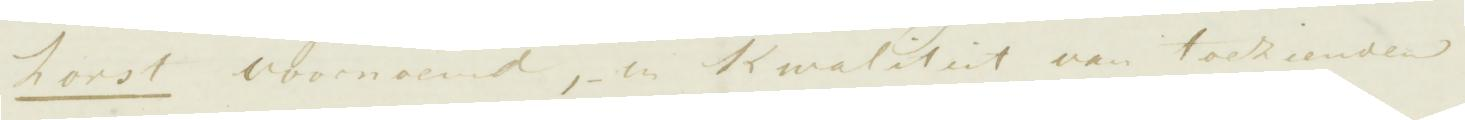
horst voornoemd,- in Kwaliteit van toezienden
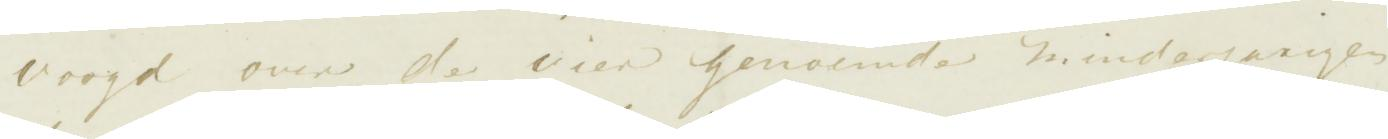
voogd over de vier genoemde minderjarigen
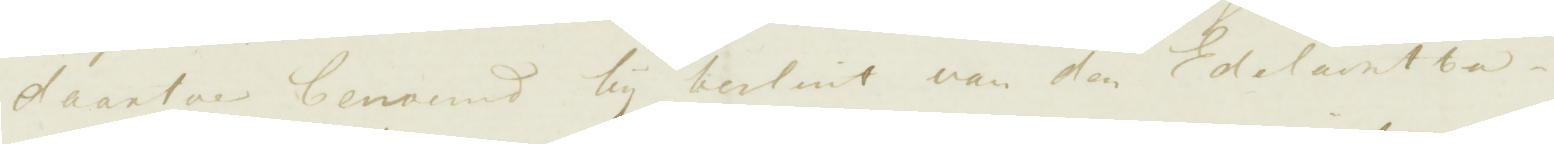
daartoe benoemd bij besluit van den Edelachtba-
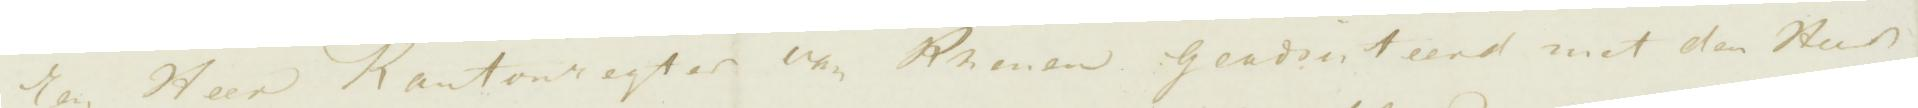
ren Heer Kantonregter van Rhenen. Geadsisteerd met den Heer
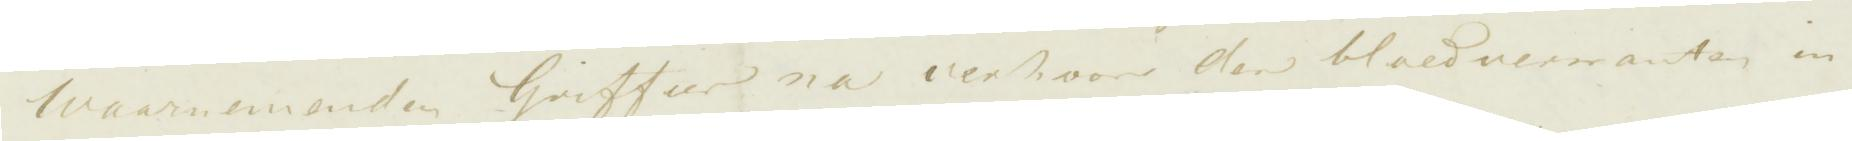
waarnemenden Griffier na verhoor den bloedverwanten in
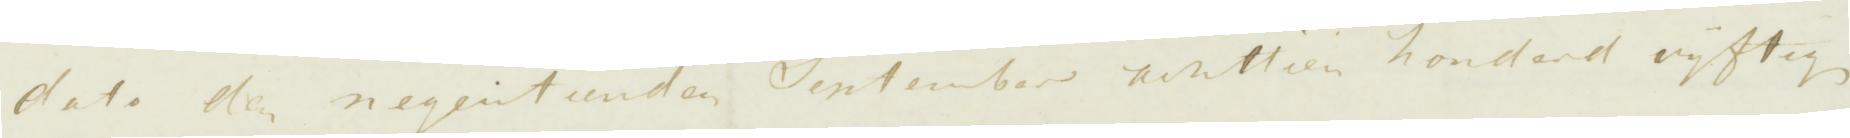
dato den negentienden September achttien honderd vijftig
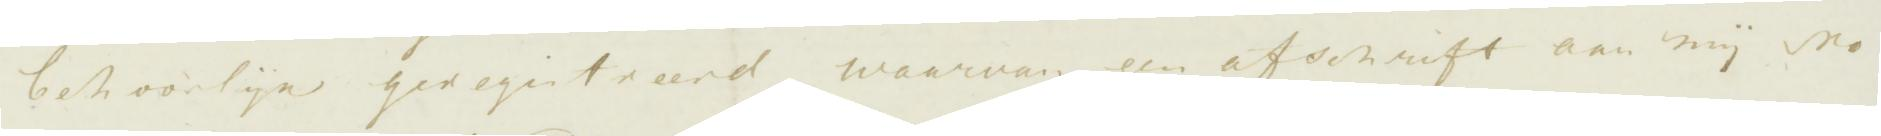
behoorlijk geregistreerd waarvan een afschrift aan mij No
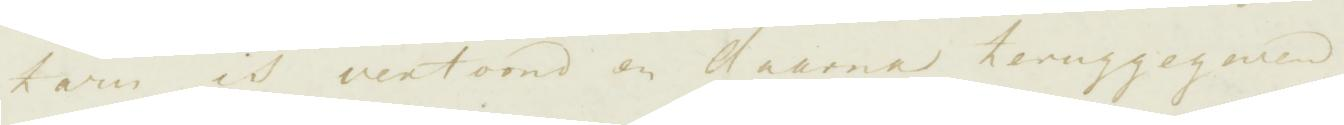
taris is vertoond en daarna teruggegeven
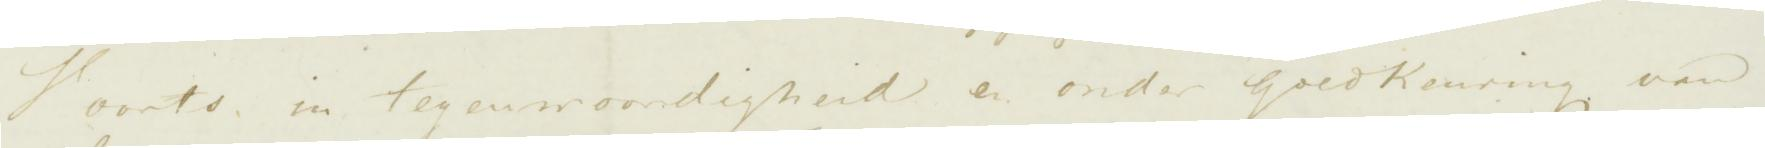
Voorts, in tegenwoordigheid en onder goedkeuring van
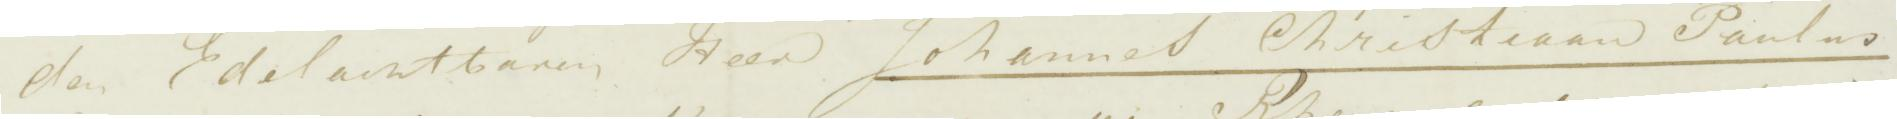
den Edelachtbaren Heer Johannes Christiaan Paulus
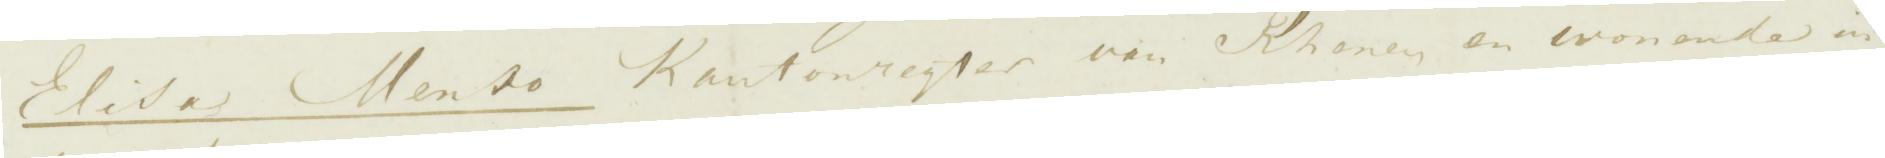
Elisa Menso Kantonregter van Rhenen en wonende in
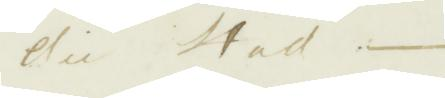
die stad —
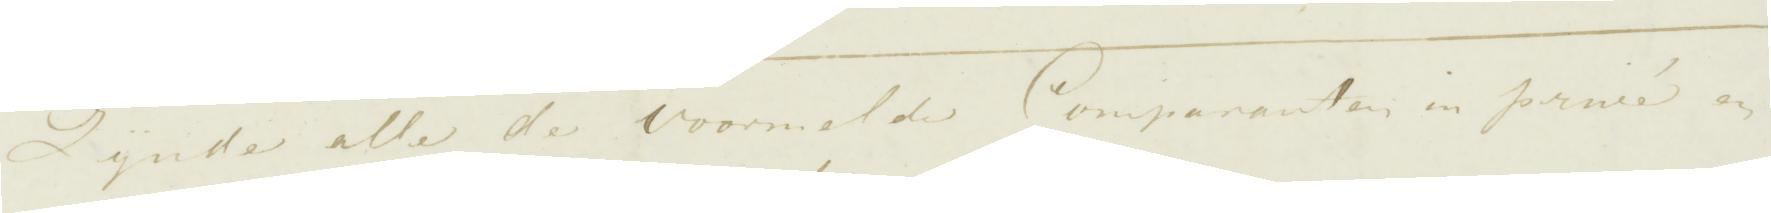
Zijnde alle de voormelde Comparanten in privé en
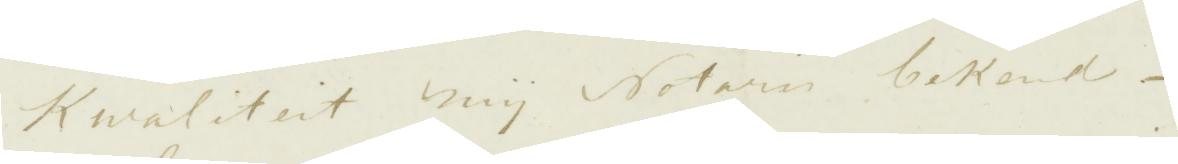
kwaliteit mij Notaris bekend-
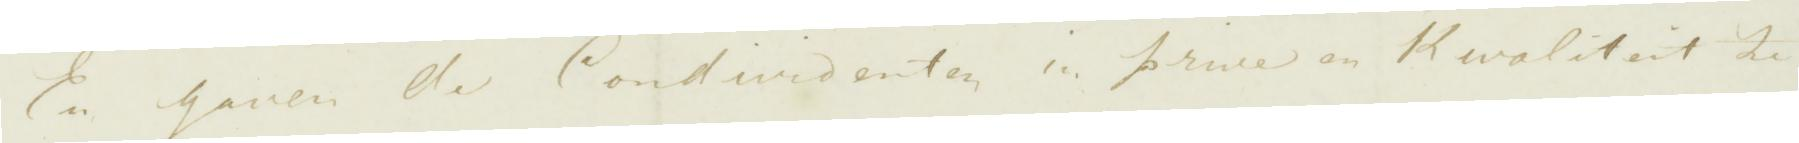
En gaven de Condividenten in privé en kwaliteit te
